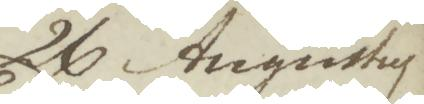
26 Augustus
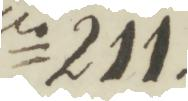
N=o 211
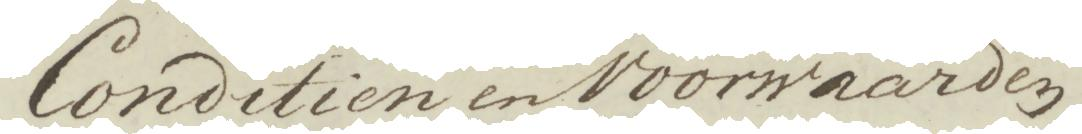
Conditien en Voorwaarden
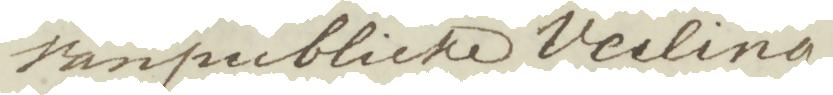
van publieke Veiling
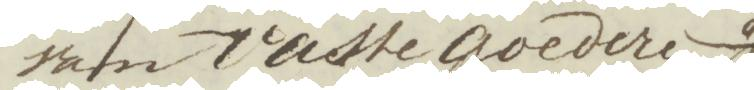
van Vaste Goederen
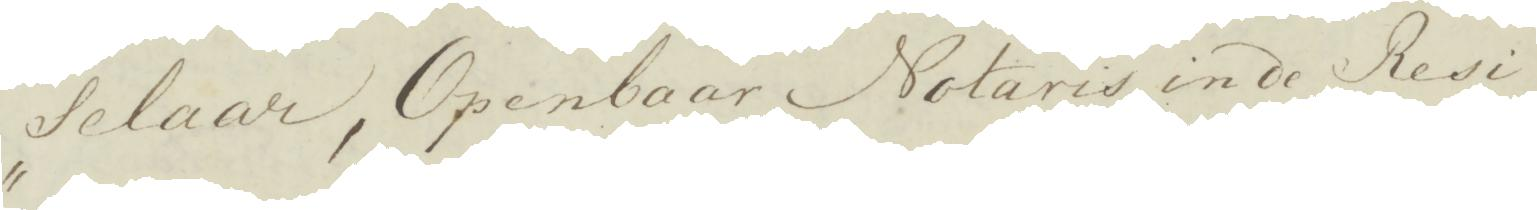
„selaar, Openbaar Notaris, in de Resi
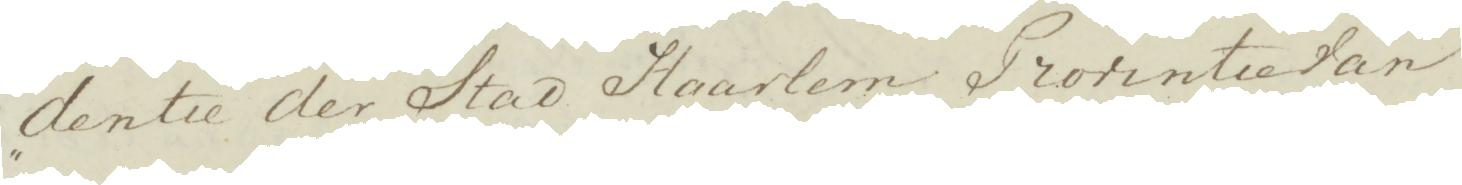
„dentie der Stad Haarlem, Provintie van
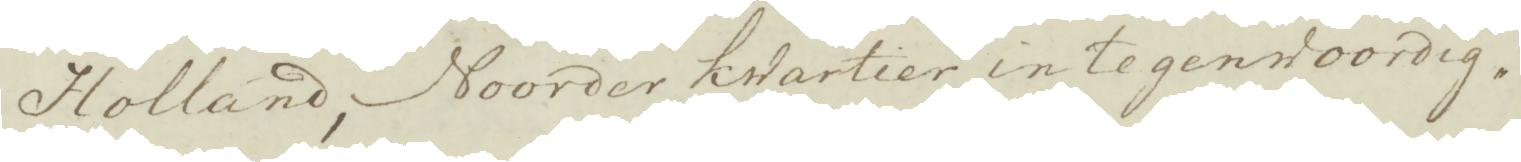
Holland, Noorder kwartier, in tegenwoordig„
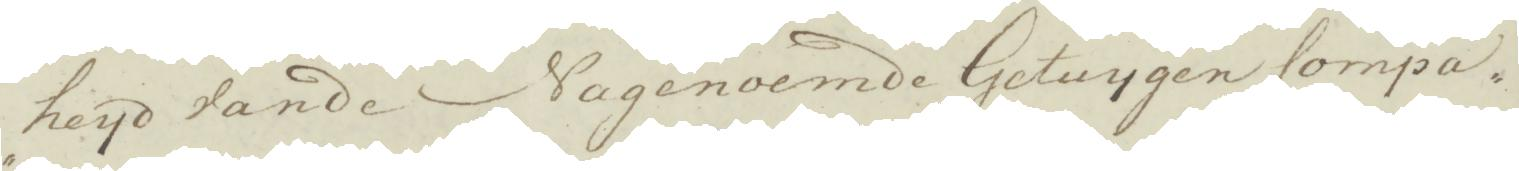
heyd van de Nagenoemde Getuygen Compa„
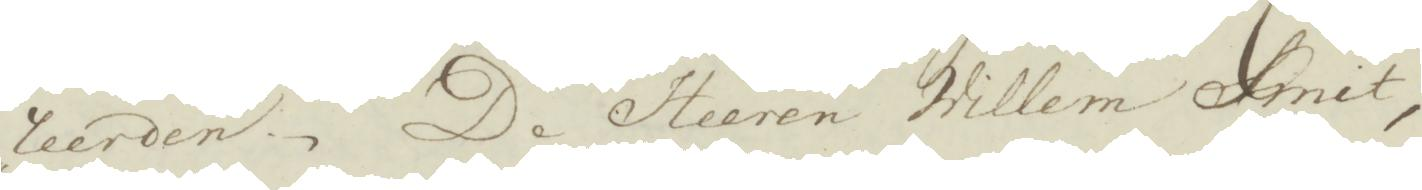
reerden — De Heeren Willem Smit,
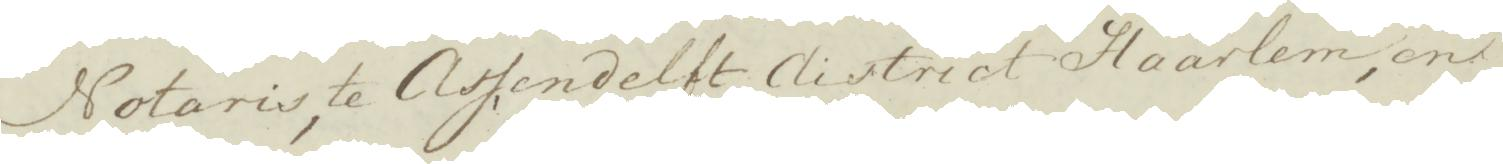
Notaris, te Assendelft, district Haarlem, en
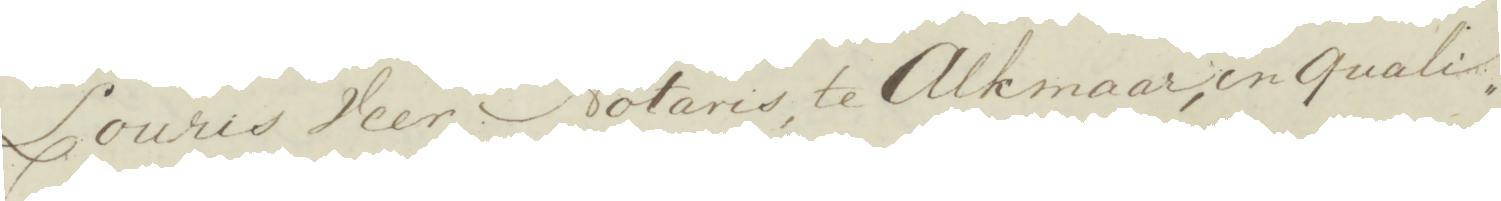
Louris Veer, Notaris, te Alkmaar, in quali
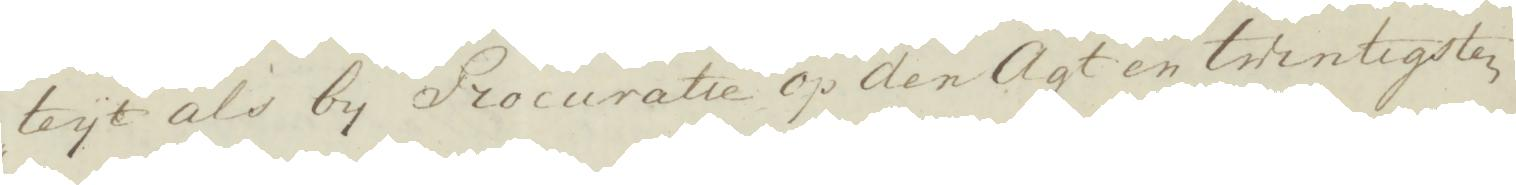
teijt als by Procuratie op den Agt en twintigsten
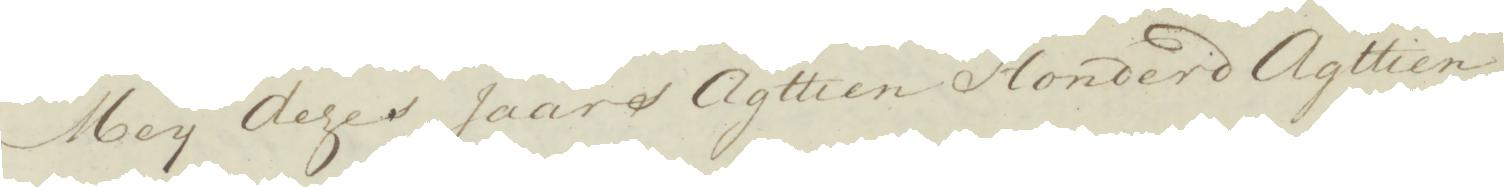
Mey dezes Jaars Agttien Honderd Agttien,
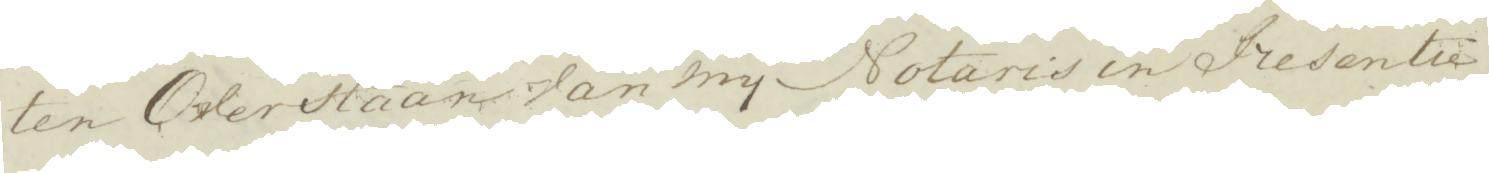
ten Overstaan van my Notaris in Presentie
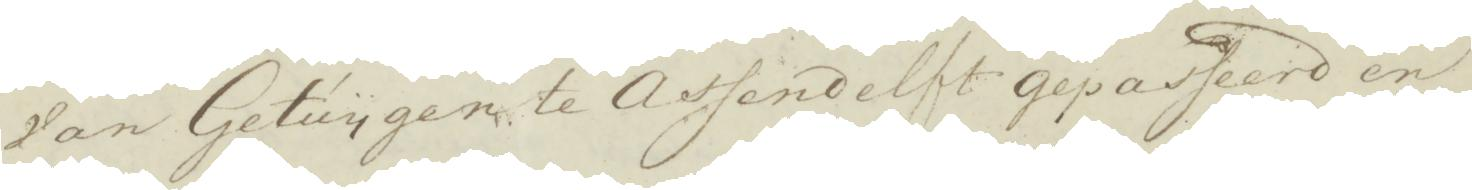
van Getuijgen, te Assendelft gepasseerd en
